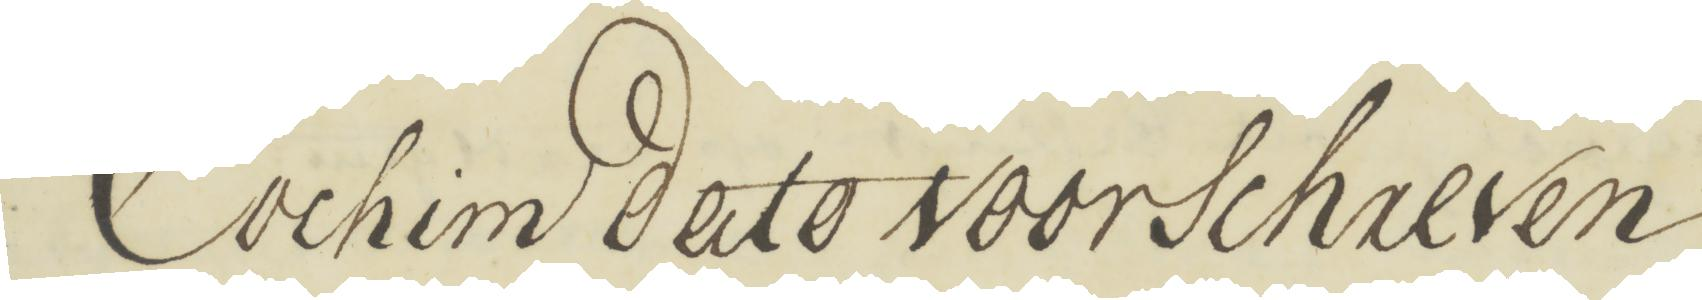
Cochim dato voorschreven
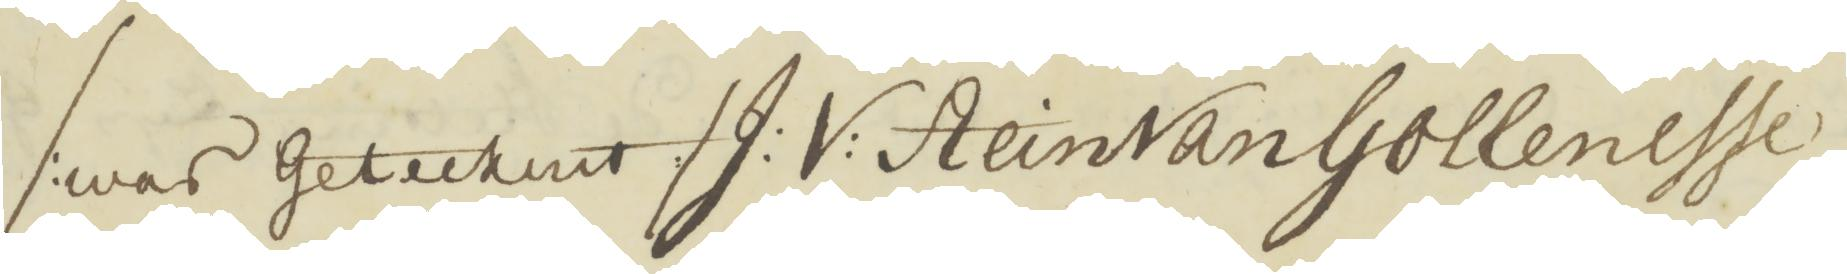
/:was geteekent :/ J: V: Stein van Gollenesse
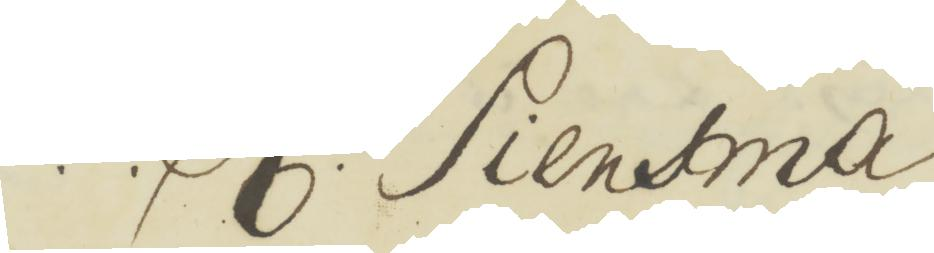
. , R:s Siersma
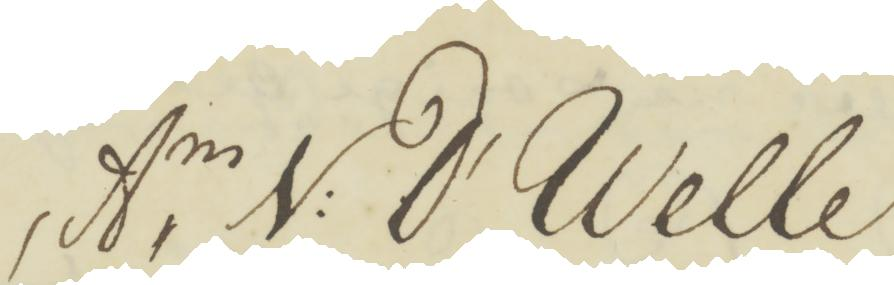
, A„m V: d' Welle
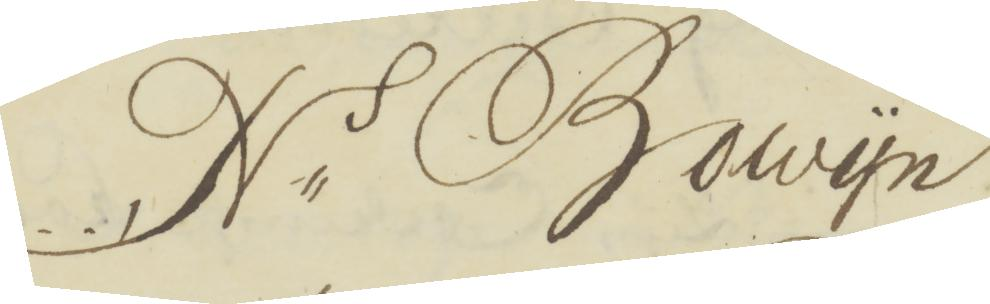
,N„s Bowijn
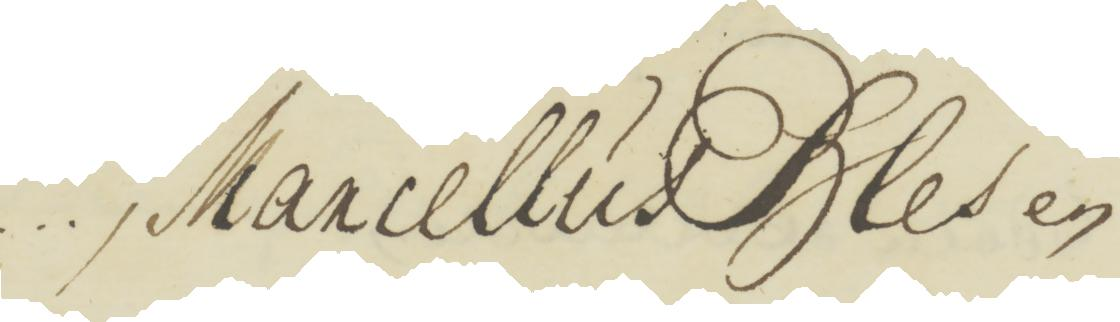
. . , Marcellus Bles en
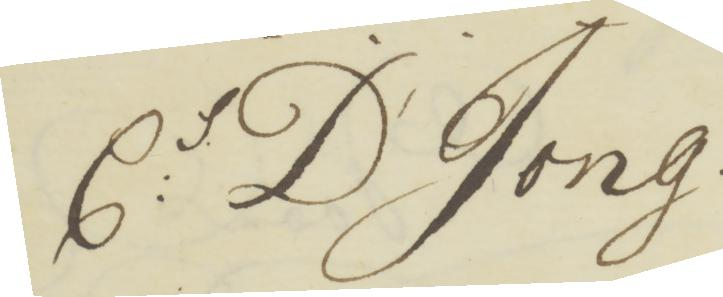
C:s D' Jong
